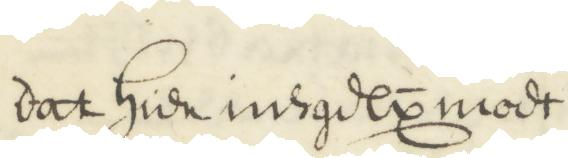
dat hier insgelx moet
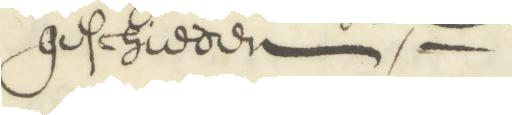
geschieden / —
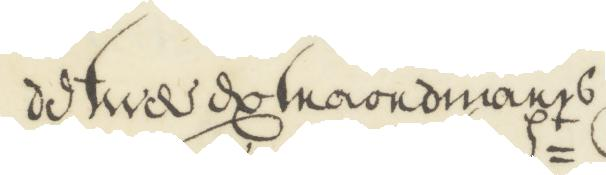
de twee extraordinaris
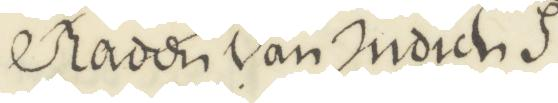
Raden van Indien S=t
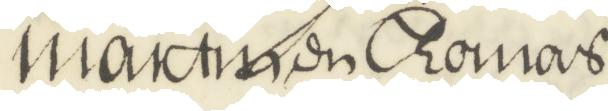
Martin en Thomas
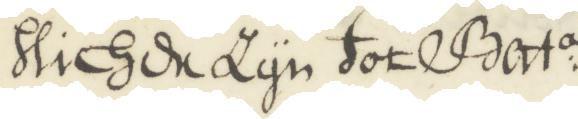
slicher zijn tot Bat:a
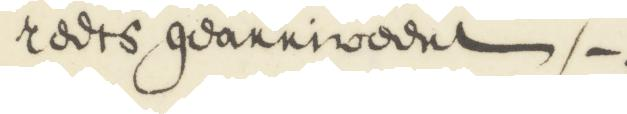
reets gearriveert /-
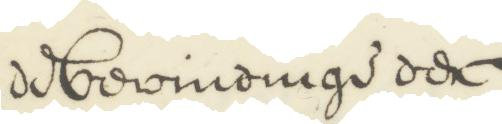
de bevindinge der
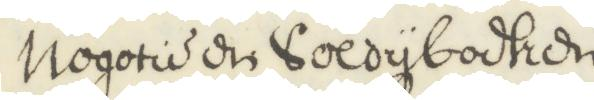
Negotie en soldijboeken
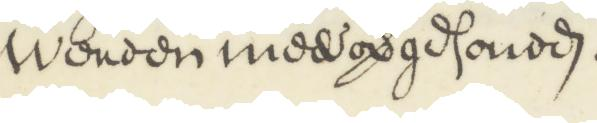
werden mede overgesonden
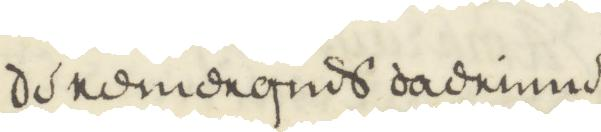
de remerques daerinne
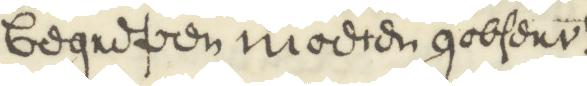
begrepen moeten g'observt:
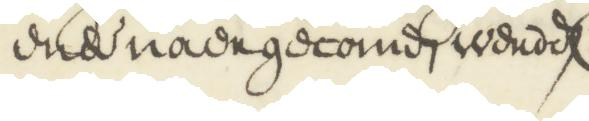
ende naergecomen werden
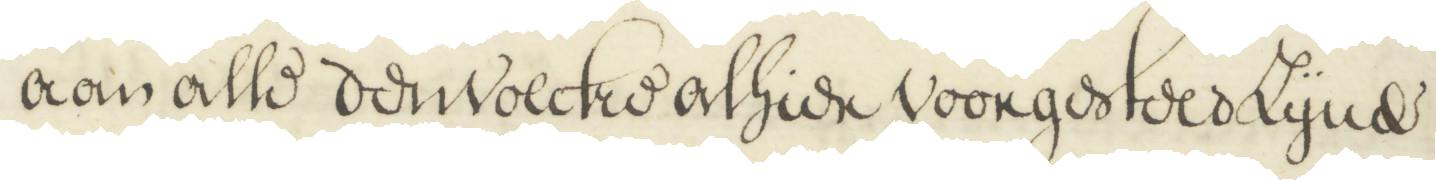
aan alle den volcke alhier voorgesteld zijnde
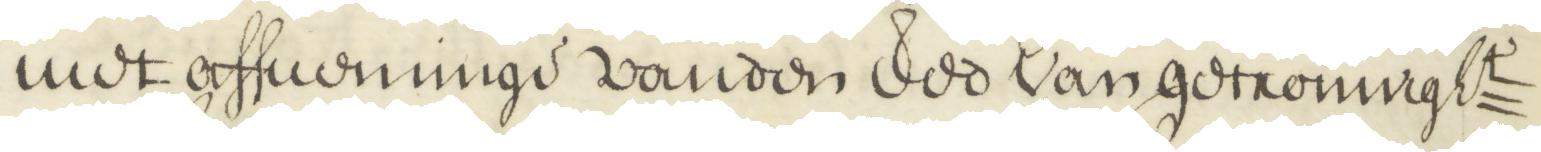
met affneminge van den Eed van getrouwigh=t
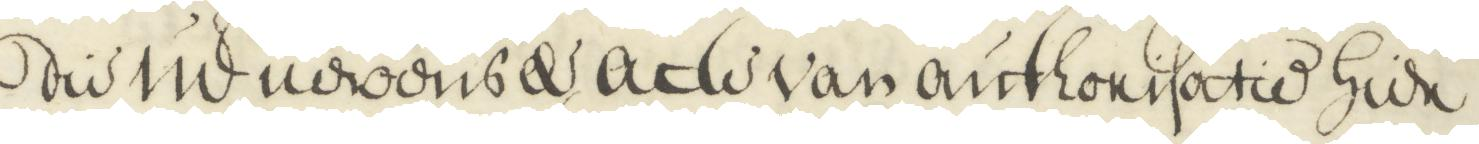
die uE nevens de acte van authorisatie hier
